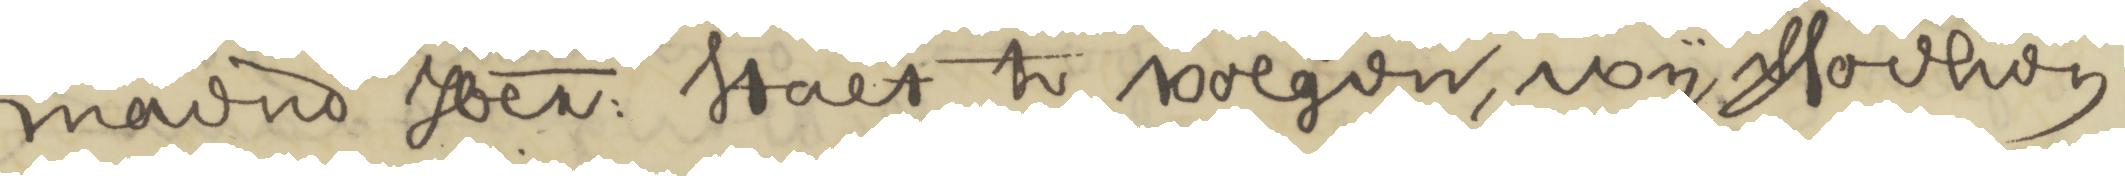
maend 7ber: staet te volgen, wij versoeken
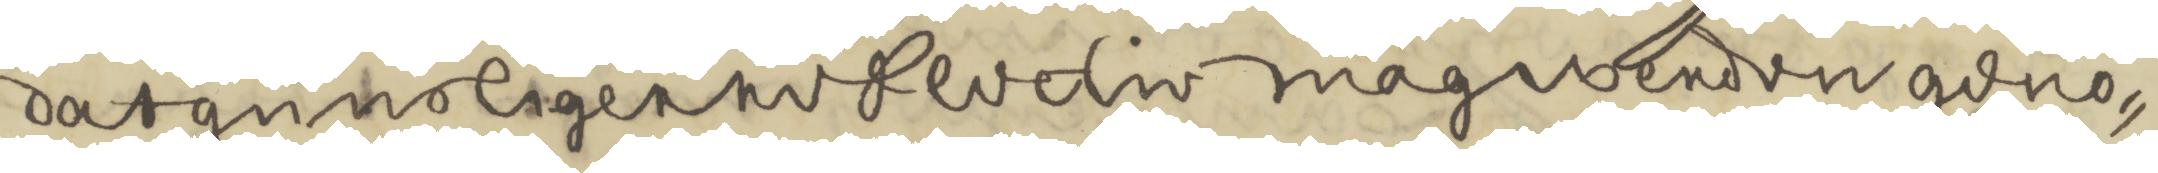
dat gunstiger reflectie mag werden geno„
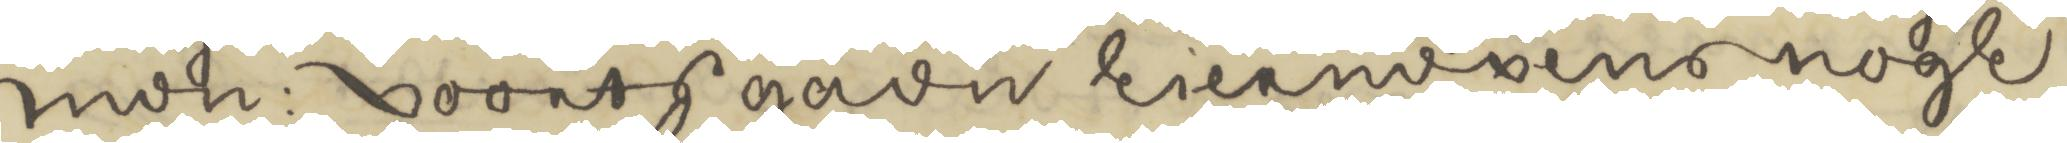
men: voorts gaen hier nevens nogh
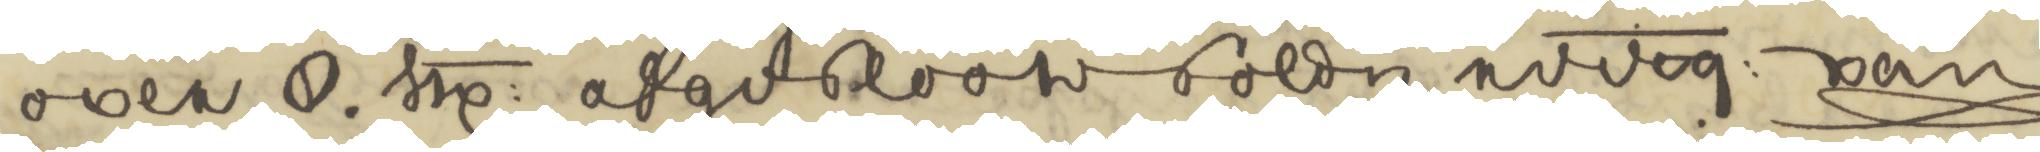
over 8. stx: afgesloote soldij reecq: van
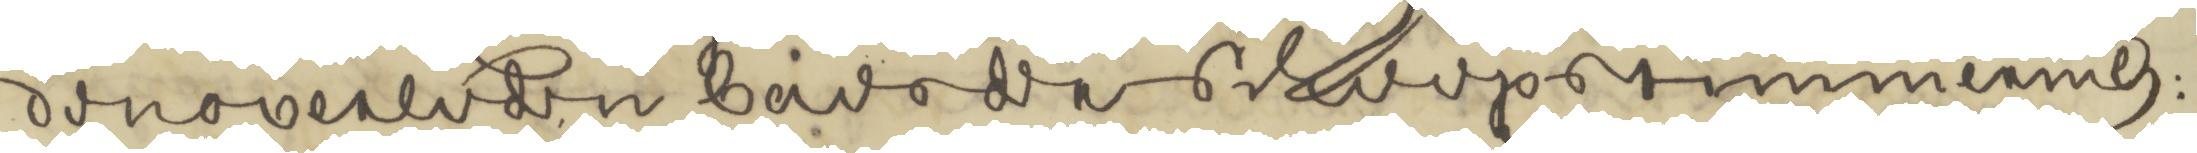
den overleden baes der scheepstimmerml:
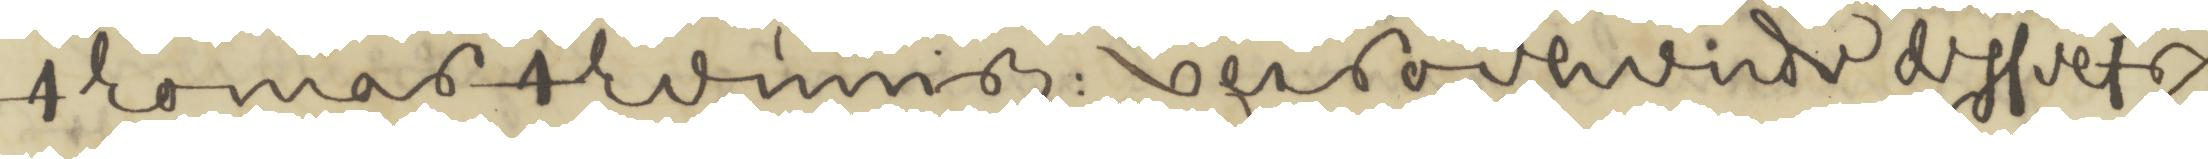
thomas theunisz: versoekende desselfs
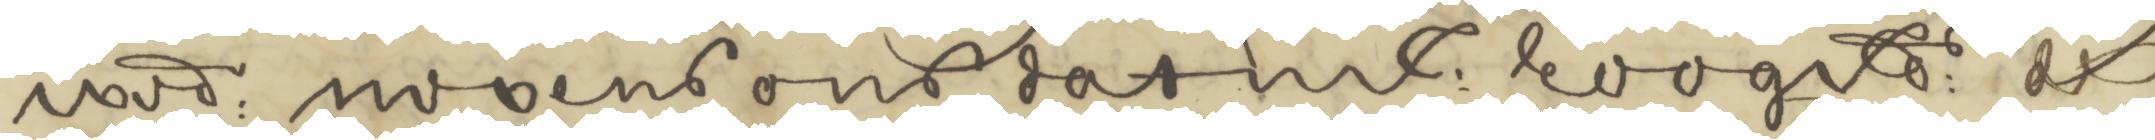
wed:e nevens ons dat uE: hoog Ed:s de
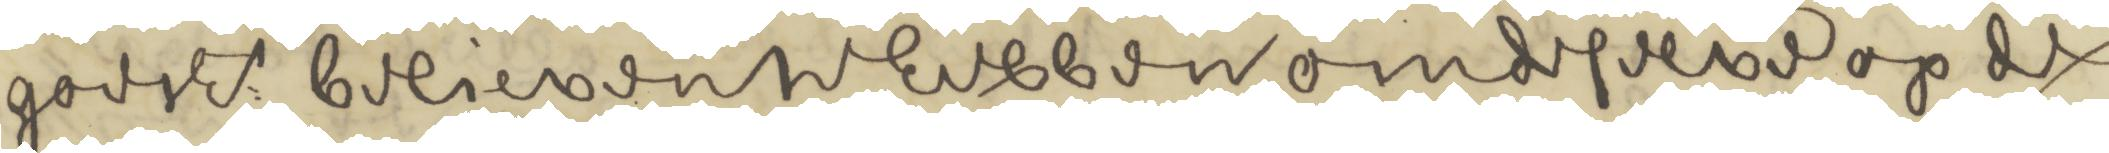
goeth:t believen te hebben om deselve op de
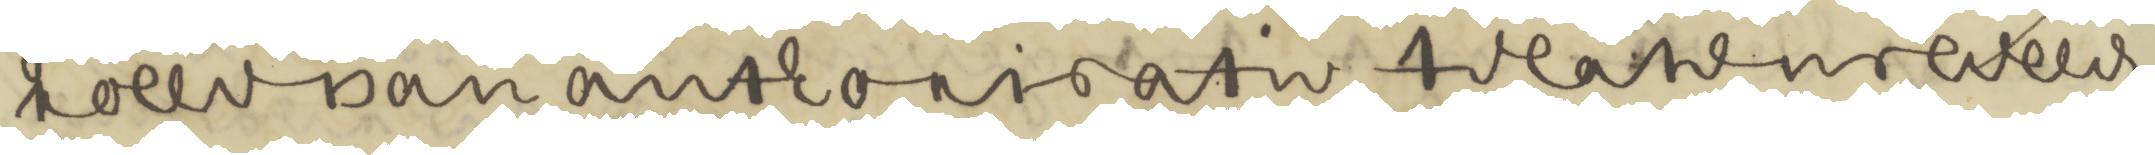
rolle van authorisatie te laten stellen
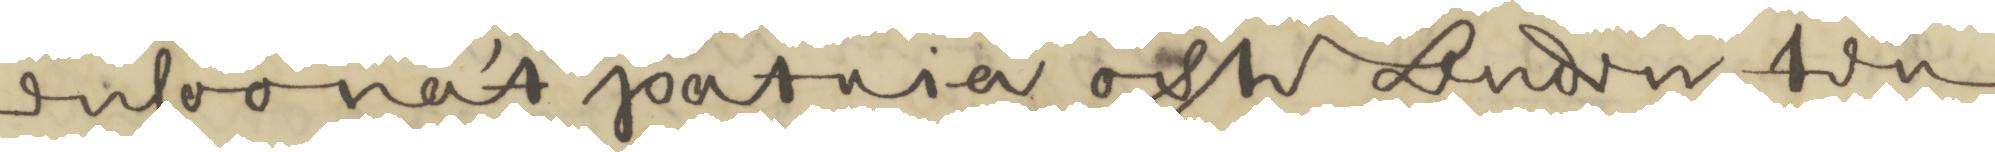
en soo na't patria over te senden, ten
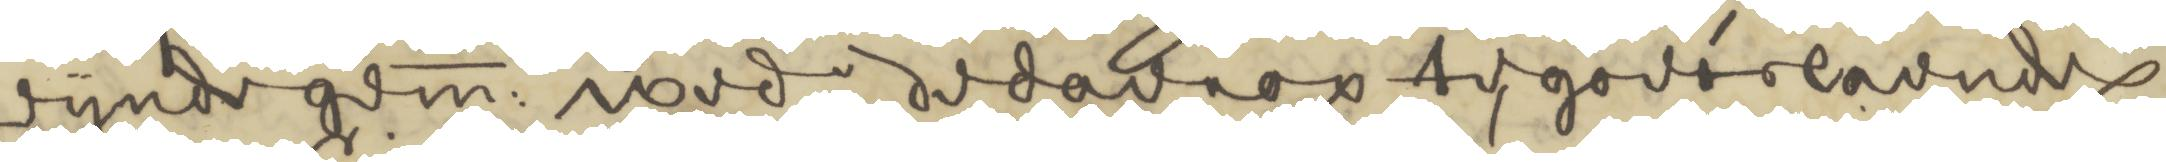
eijnde gem: wed:e de daerop te goetstaende
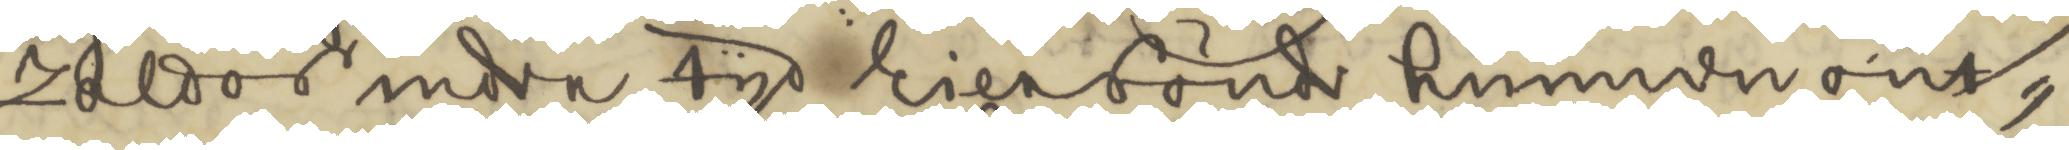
zaldos inder tijd hier soude kunnen ont„
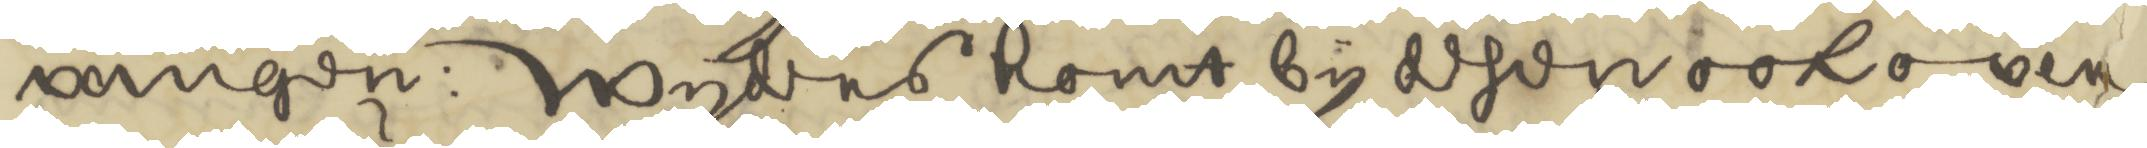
vangen: wijders komt bij desen ook over
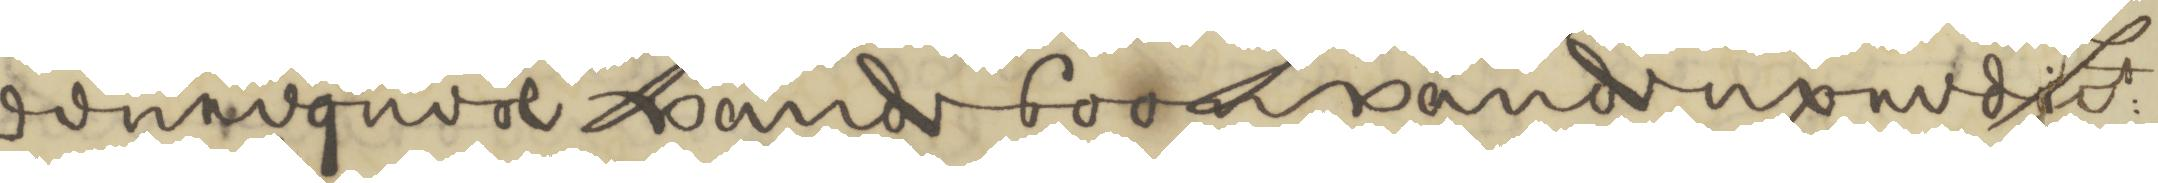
een request van de soon van den predic:t
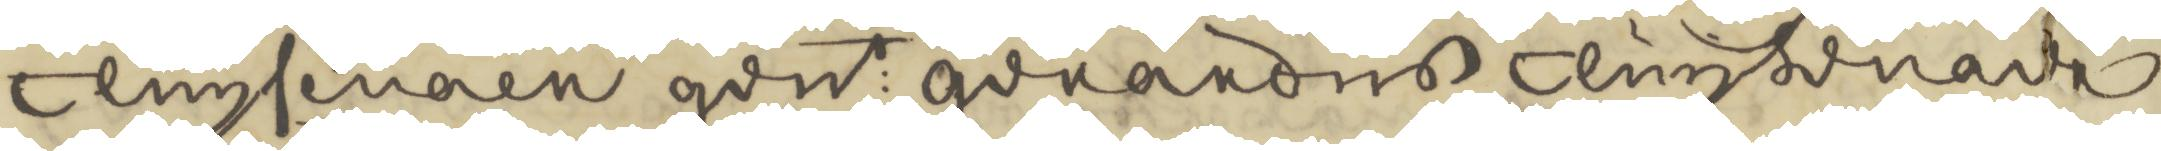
Cluijsenaer gen:t gerardus Cluijsenaer
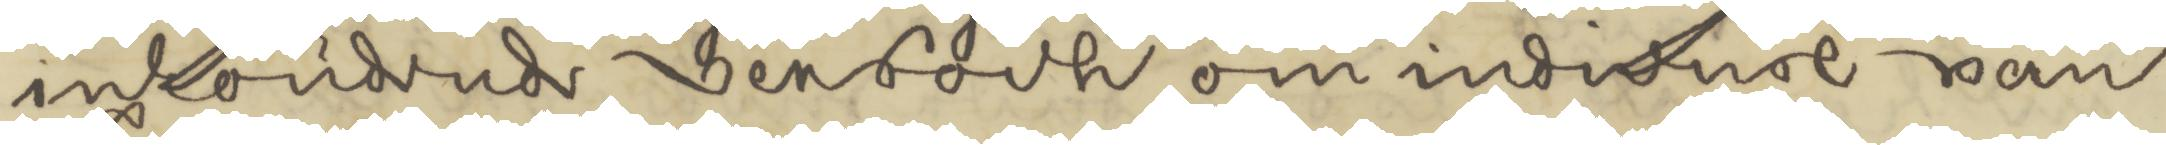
inhoudende versoek om indienst van
